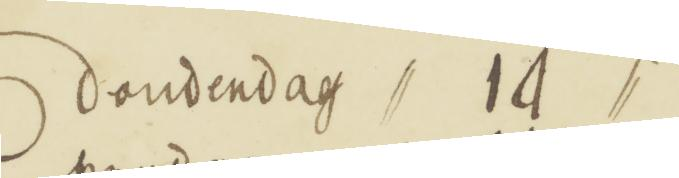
donderdag „ 14 „
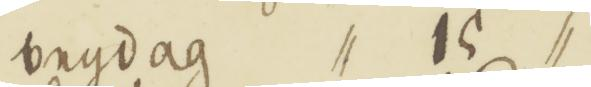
vrydag „ 15 „
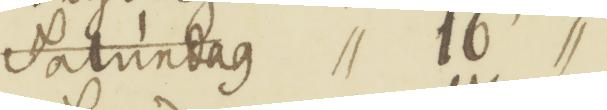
Saturdag „ 16 „
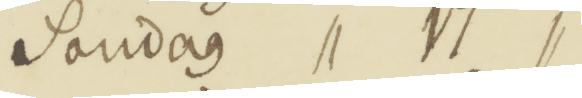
Sondag „ 17 „
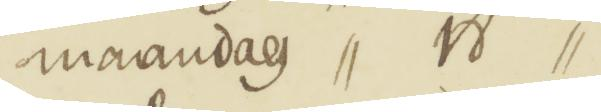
maandag „ 18 „
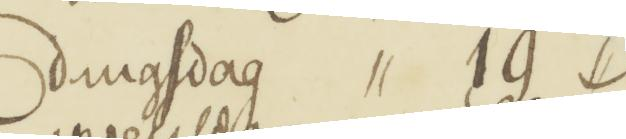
dingsdag „ 19 „
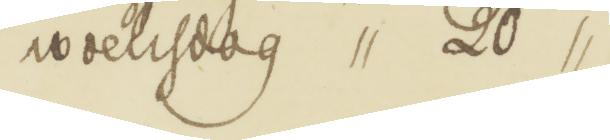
woensdag „ 20 „
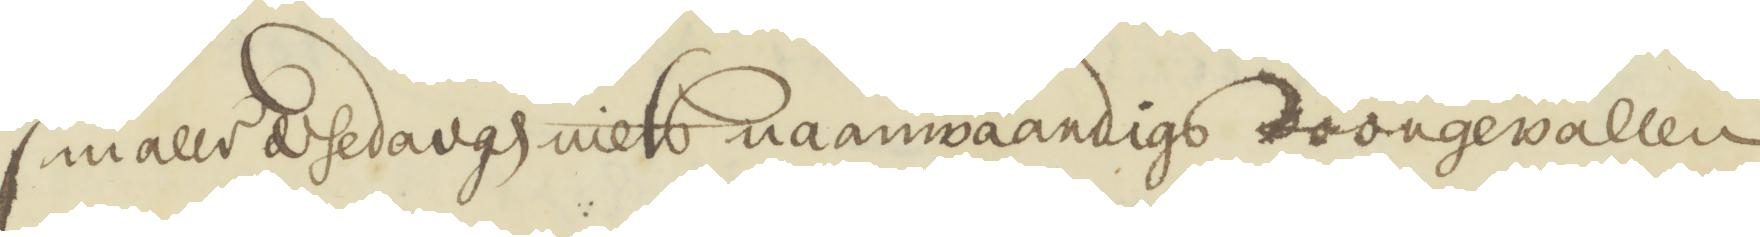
} in alle dese daegen niets naamwaardigs voorgevallen
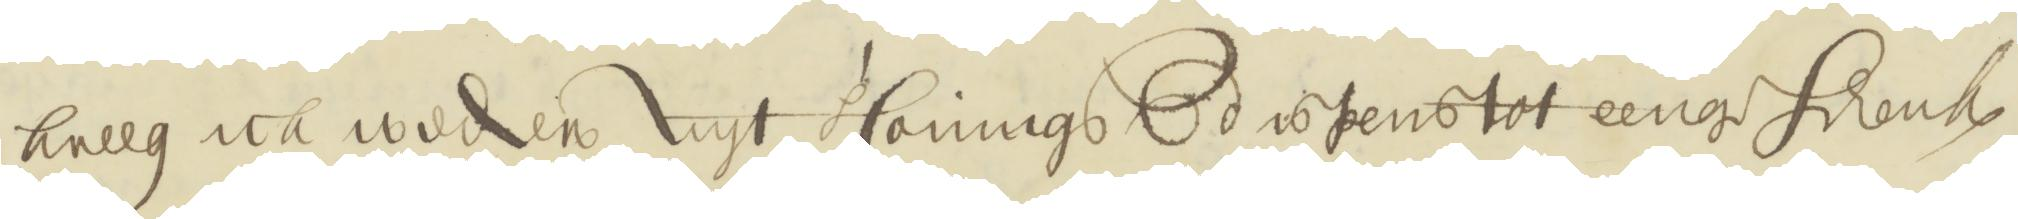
kreeg ick weder uyt 's Conings dispens tot eengeschenk
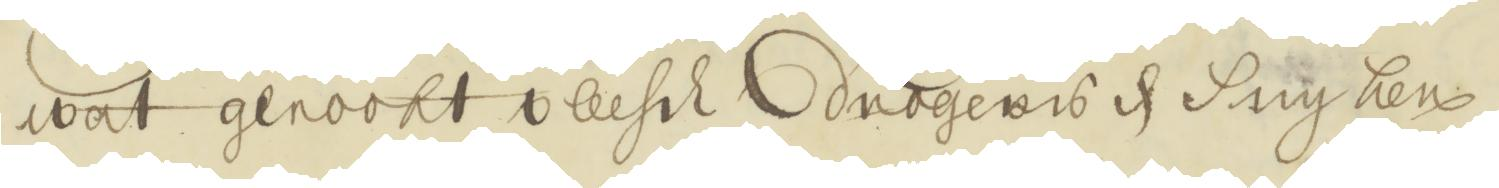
wat gerookt vleesch droge vis en Suyker
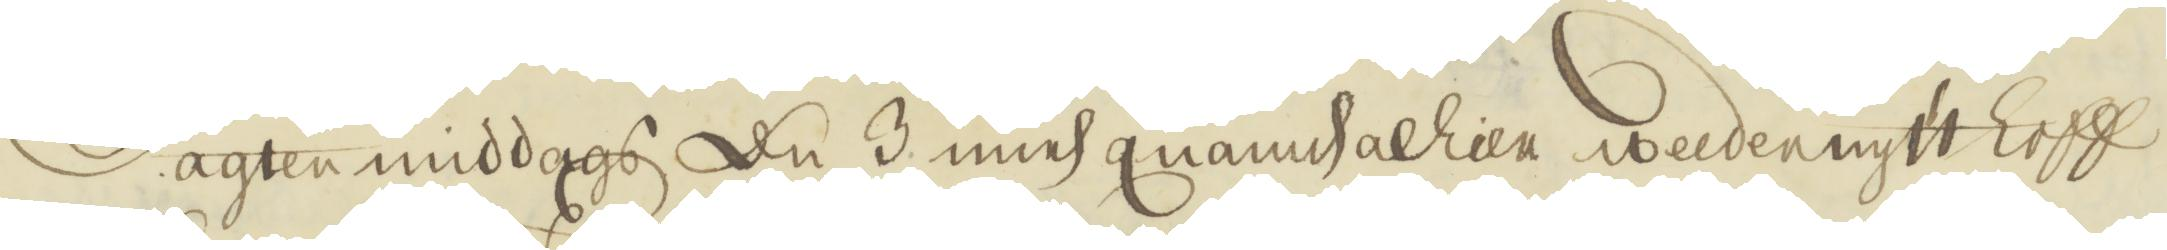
'S agter middags ten 3 uuren quamen alhier weeder uyt 't hoff
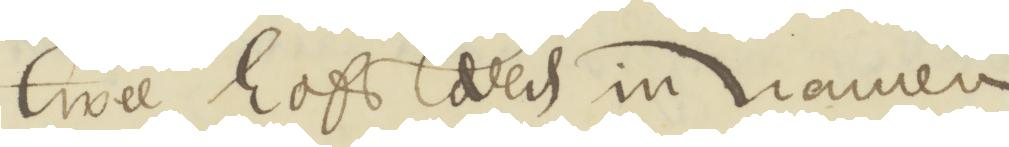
twee hofs Edelen in namen
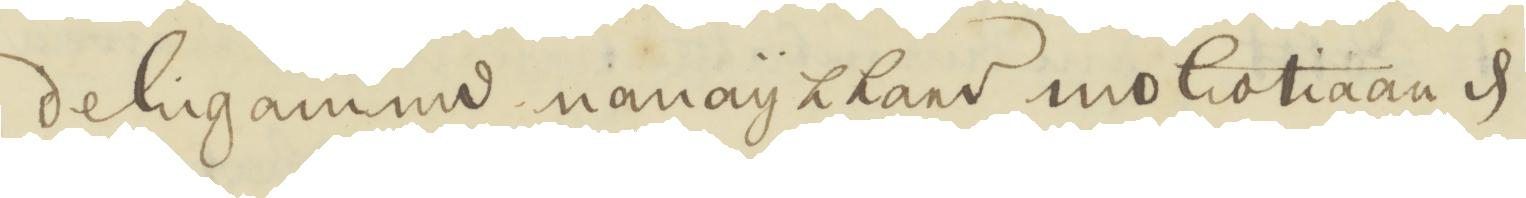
de higamme nanaijkkare mohotiaan en
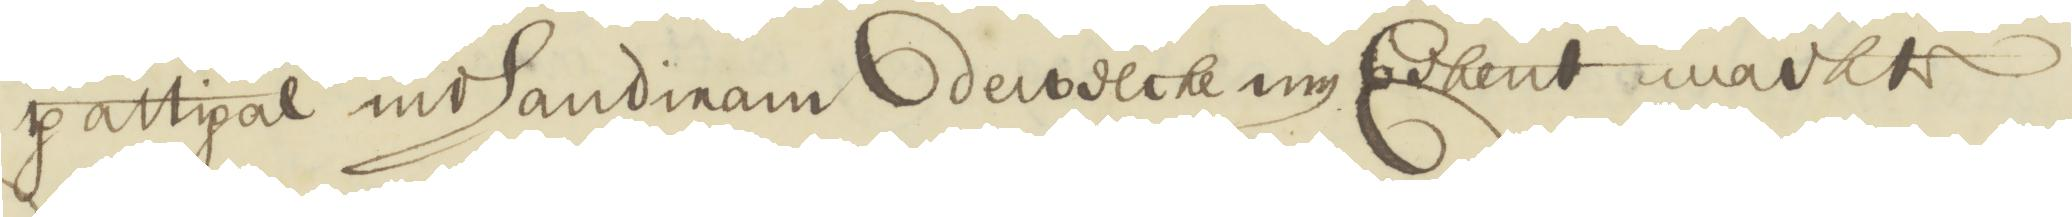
pattipal mohandiram dewelcke my bekent maekte
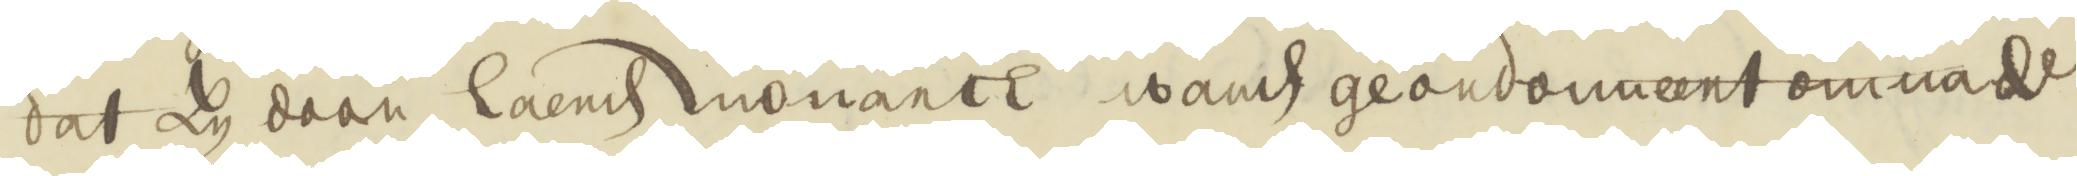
dat Zy door haeren monarch waren geordonneert om nade
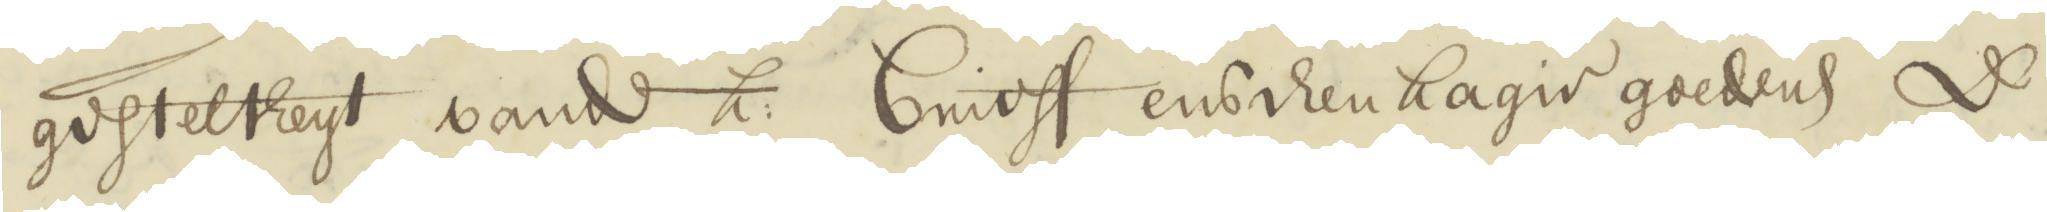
gesteltheyt vande k: brieff en schenkagie goederen te
